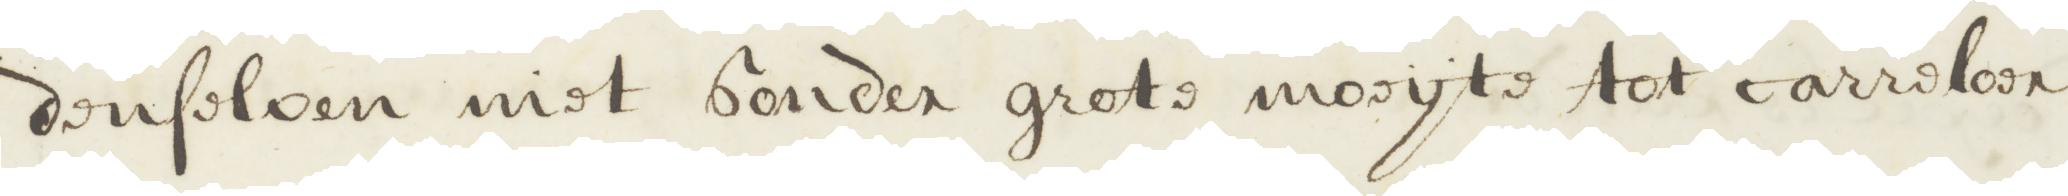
denselven niet sonder grote moeijte tot carreloer
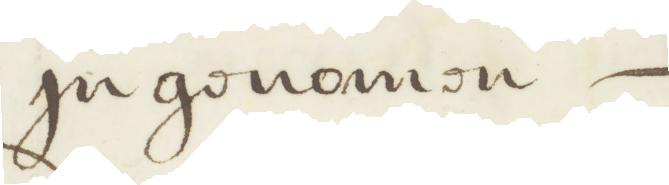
jn genomen -
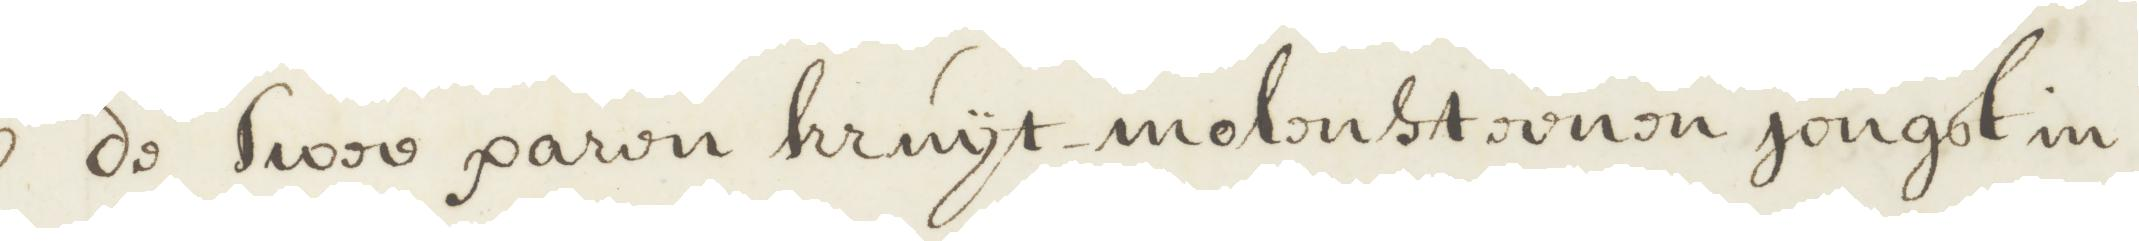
de twee paren kruijt-molensteenen jongst in
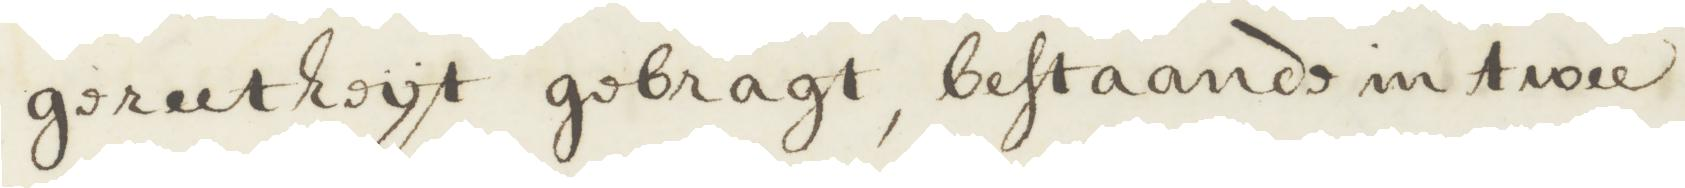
gereetheijt gebragt, bestaande in twee
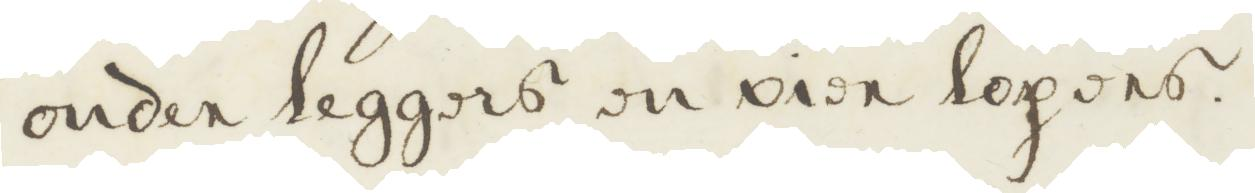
onder leggers en vier lopers.
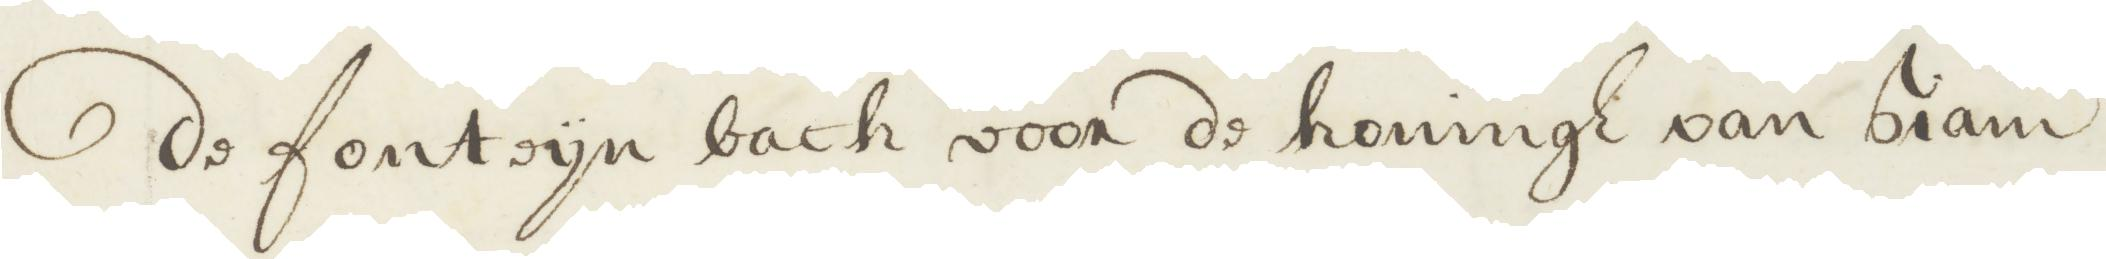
de fonteijn back voor de koningh van siam
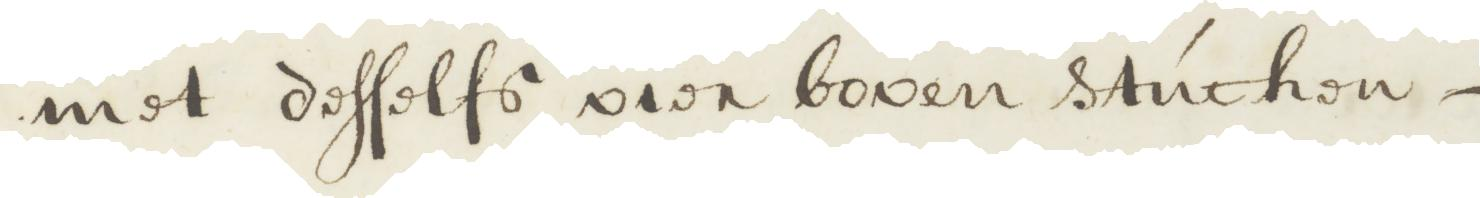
met desselfs vier boven stucken
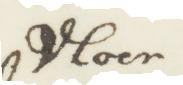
vloer
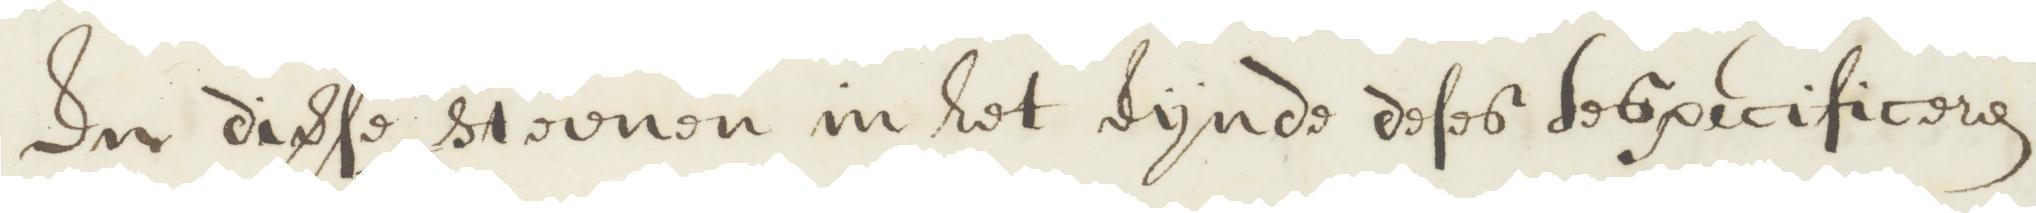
En diverse # steenen in het Eijnde deses tespecificeren
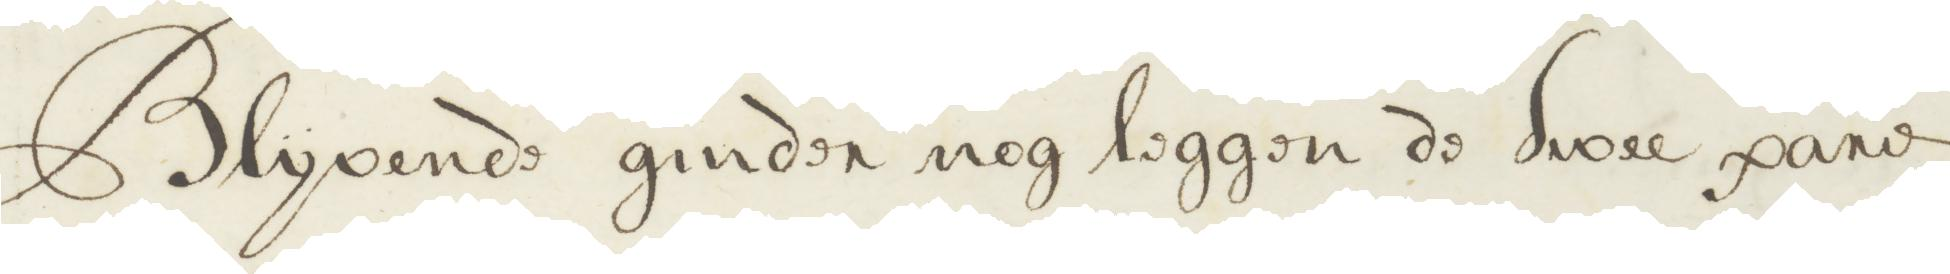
Blijvende ginder nog leggen de twee paren
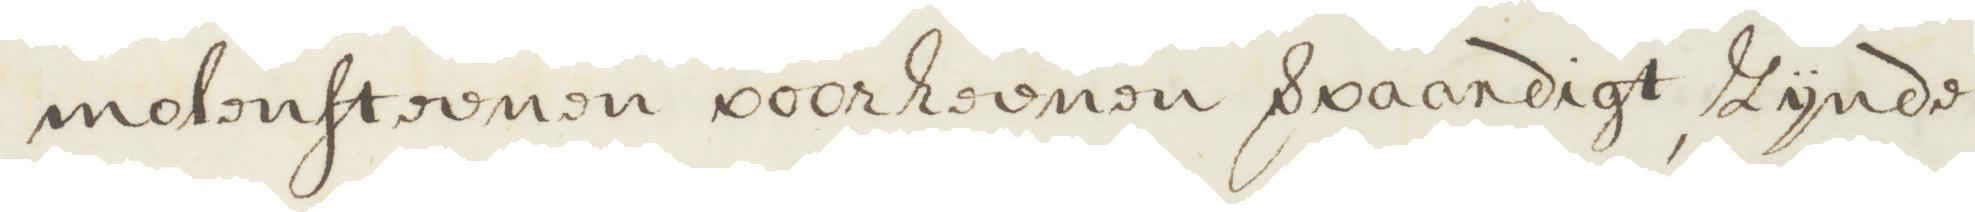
molensteenen voorheenen vervaardigt, Zijnde
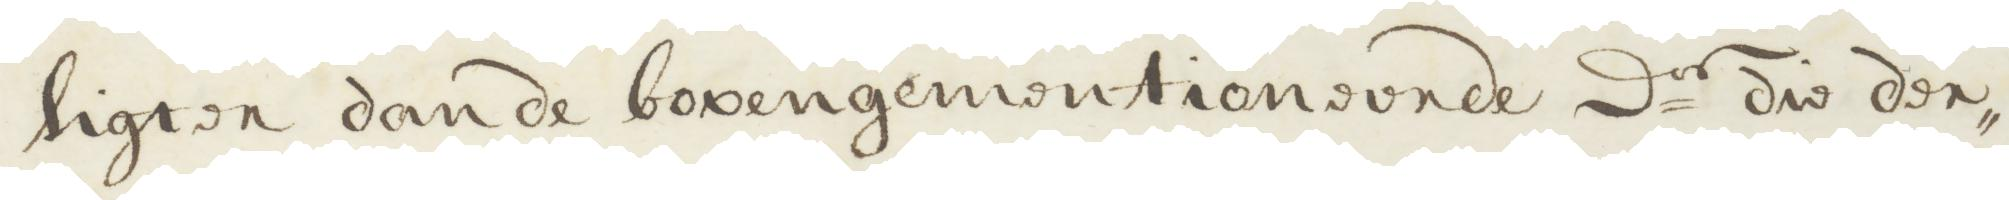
ligter dan de bovengementioneerde D=os die der„
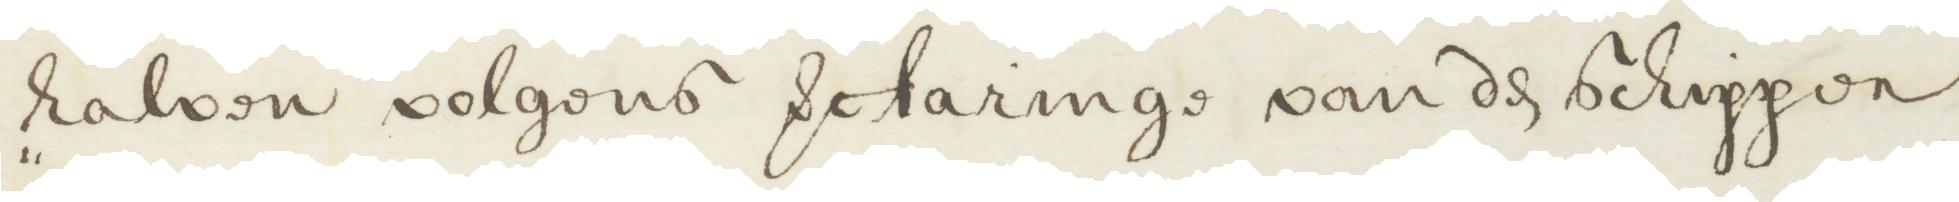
„halven volgens verclaringe van den schipper
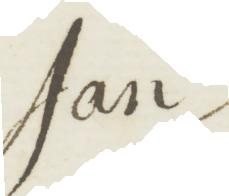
Jan
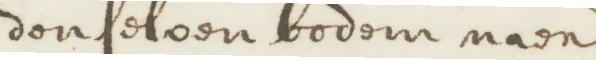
denselven bodem near
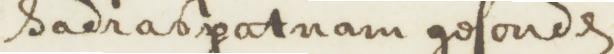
sadraspatnam gesonden
